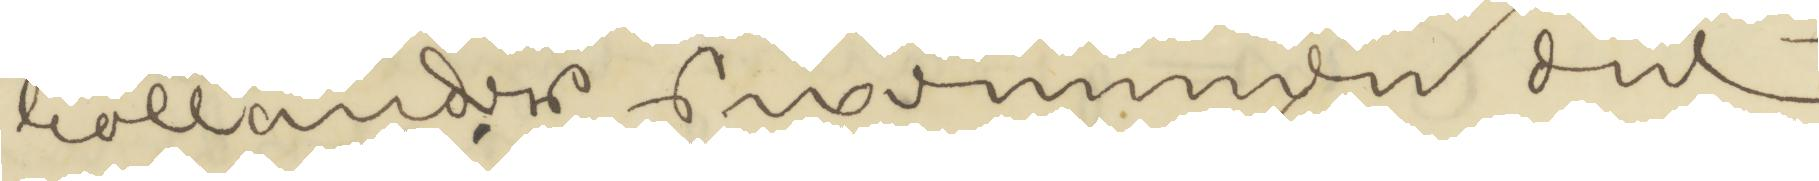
hollander swemmen die
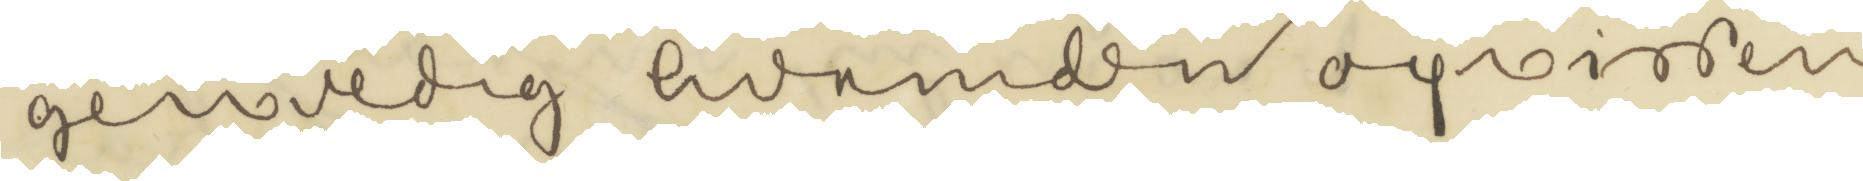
geweldig kermden opvissen
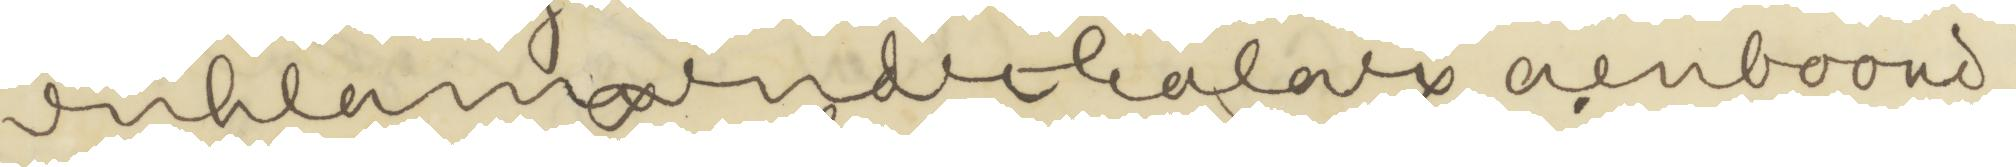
en klampen de chaloup aenboord
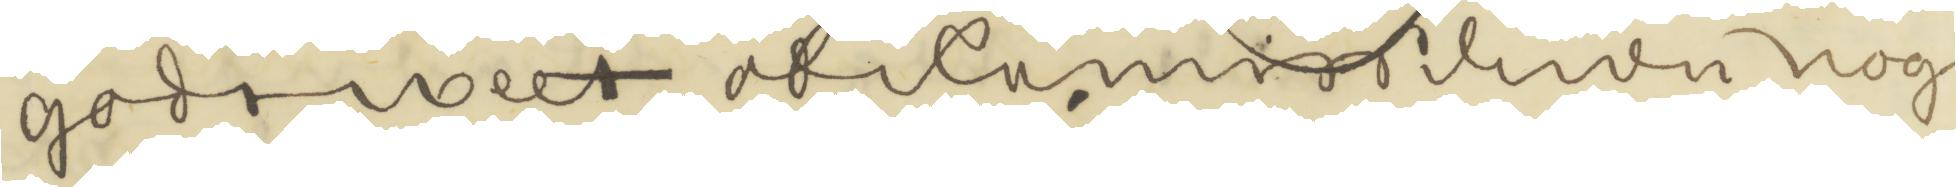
godt weet of Ermisschien nog
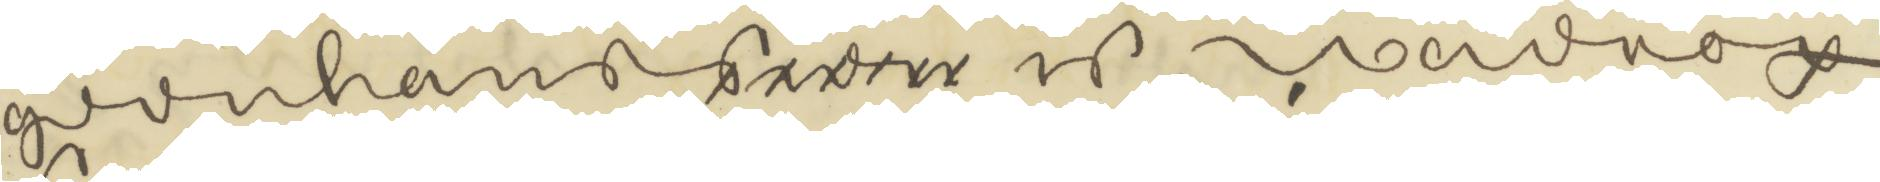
geen kans sien is, waerop
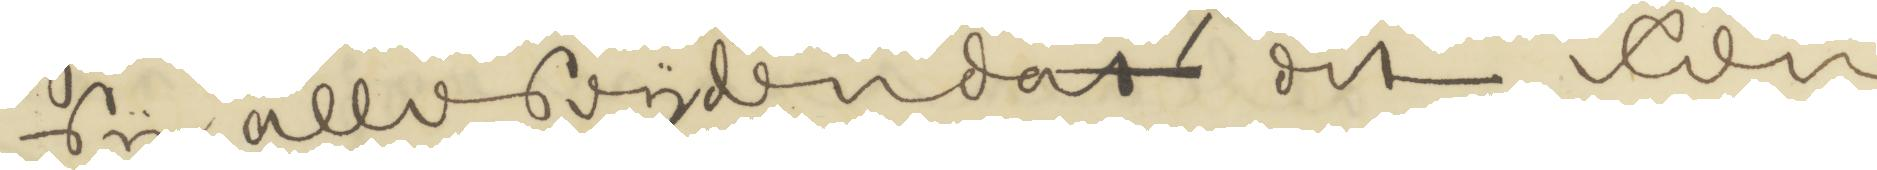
sij alle seijden dat dit Een
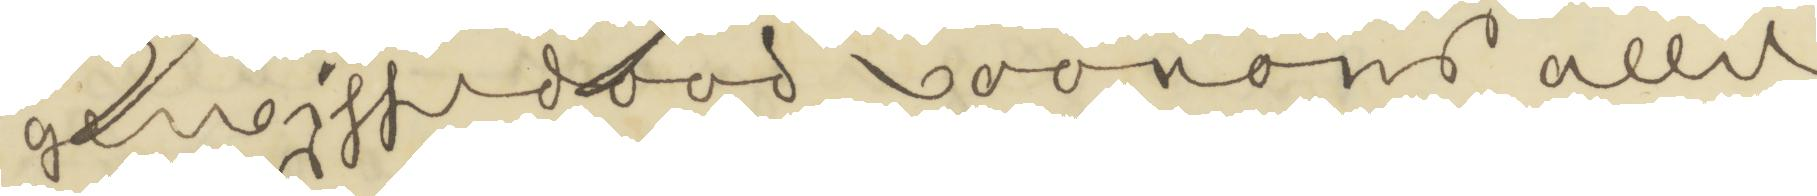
gewisse dood voorons alle
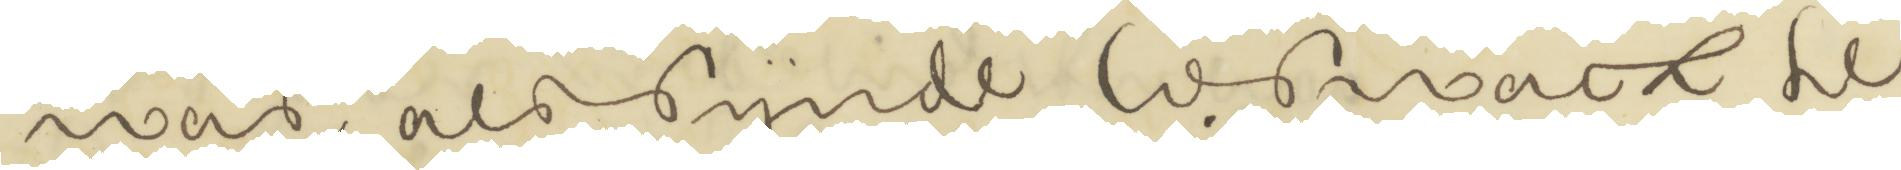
was, als sijnde teswack te
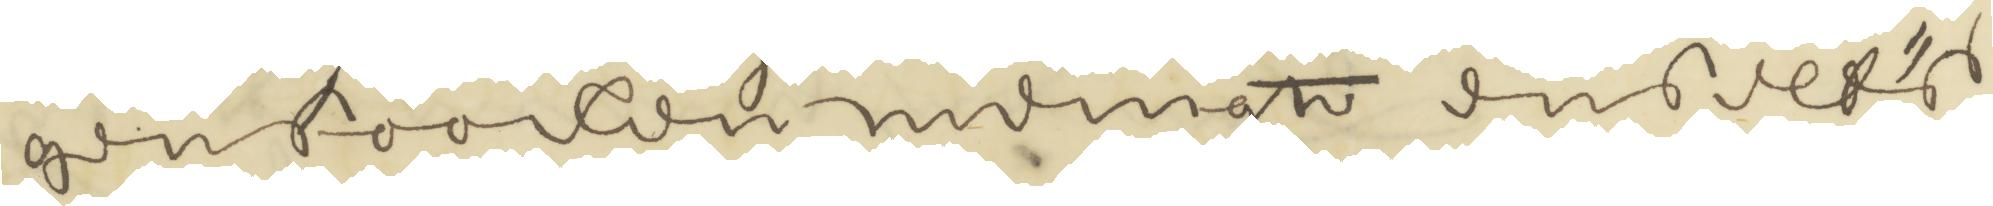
gen soo Een menigte en selfs
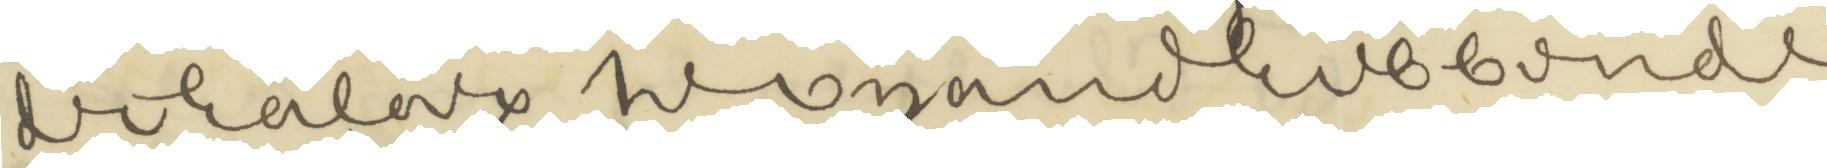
de chaloup te vijand hebbende
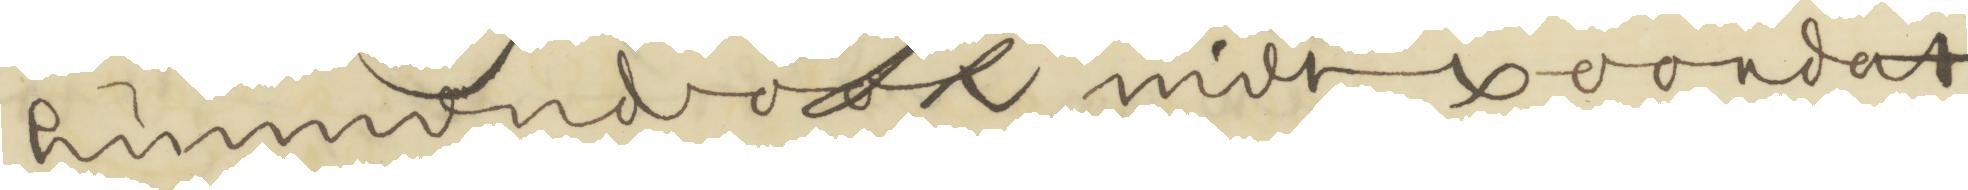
kunnende ook niet voordat
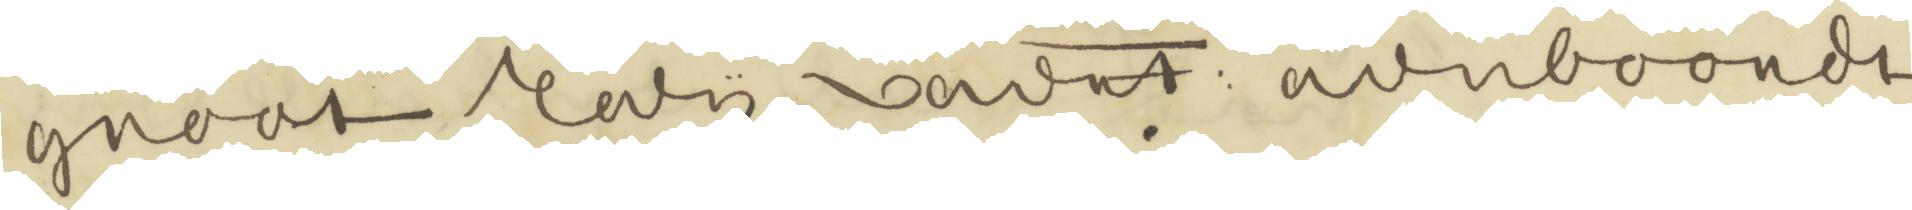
groot raeij vaert: aenboordt
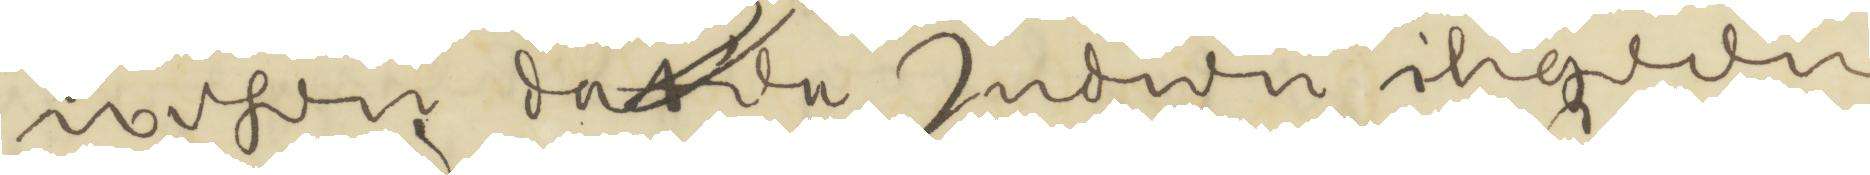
wesen dat en Jndien ik geen
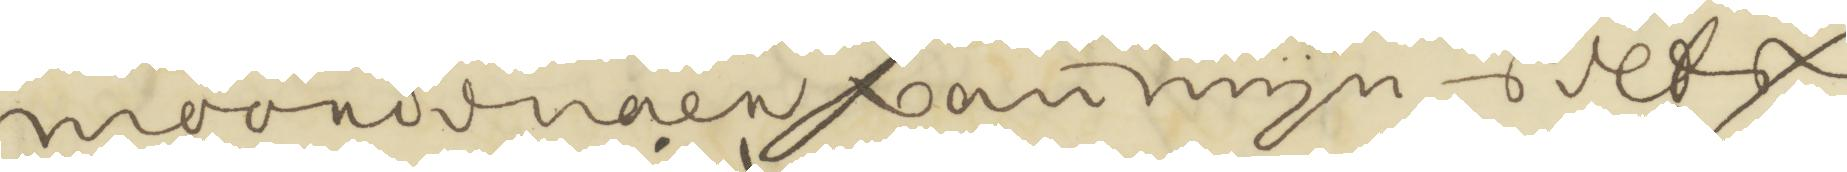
moordenaer van mijn selfs
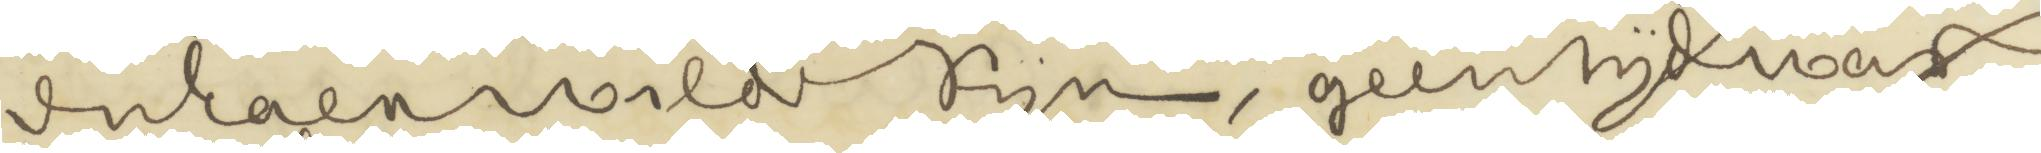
en haer wilde sijn, geen tijd was
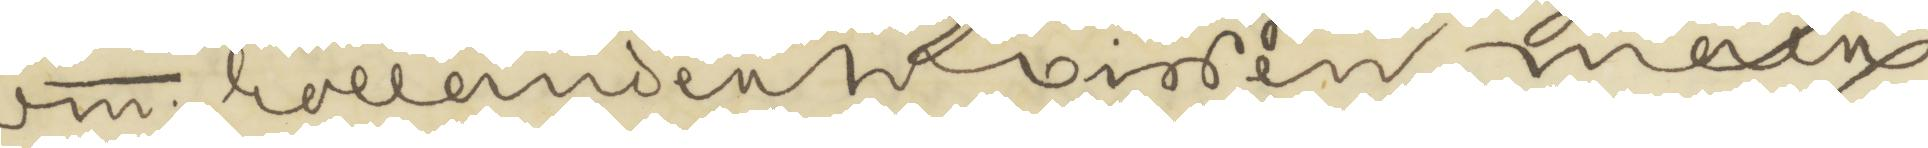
gem: hollander te vissen, maer
